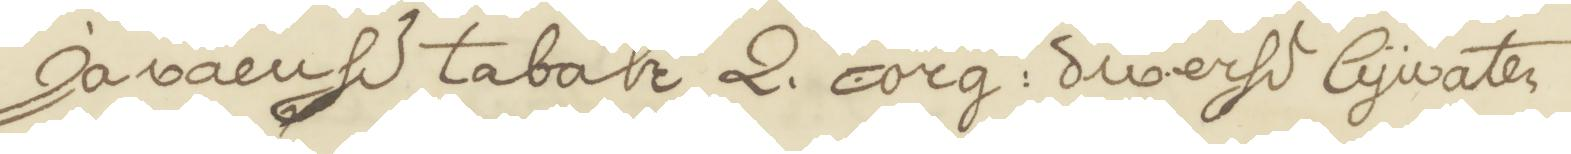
javaense tabak 2. corg:d diverse lijwaten
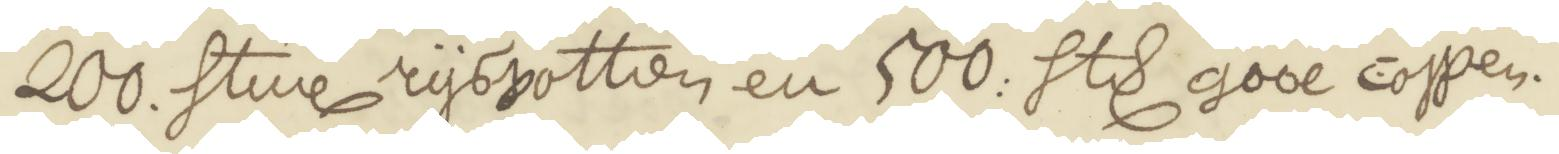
200. stux rijspotten en 500: stver gove Coppen.
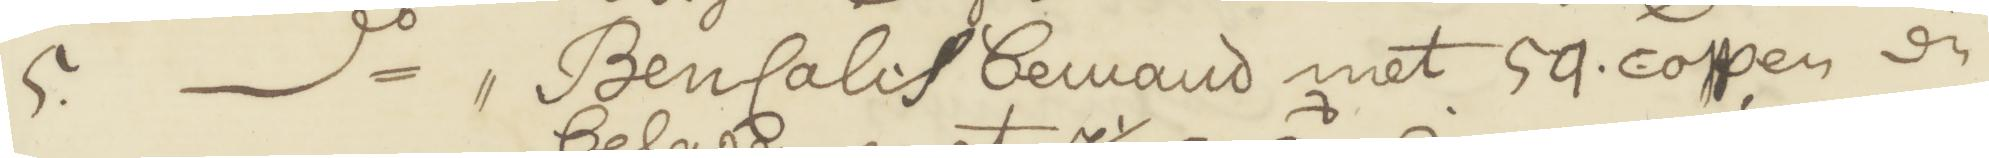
5. _=o „ Bencalis bemand met 54. coppen en
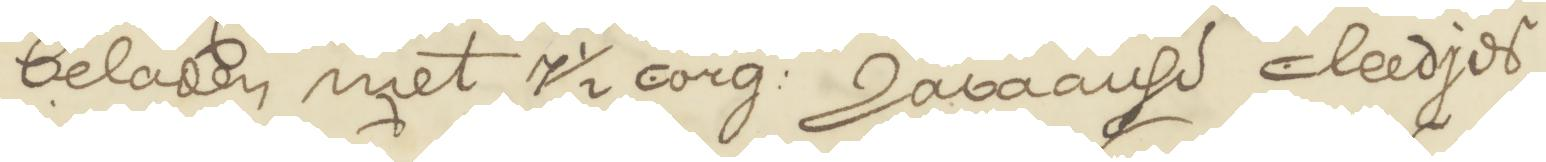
beladen met 7½ corg:s javaanse cleedjes,
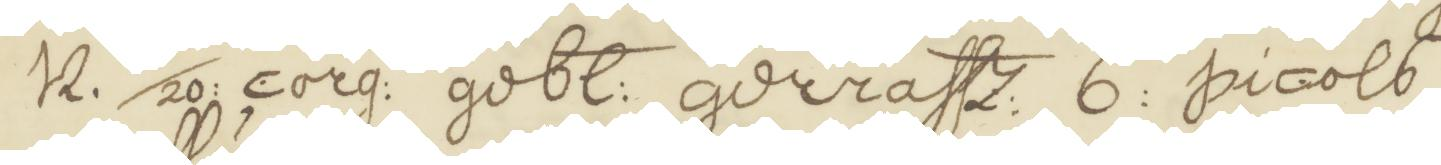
12. 7/20: corg:s gebl: gerraffz: 6: picols
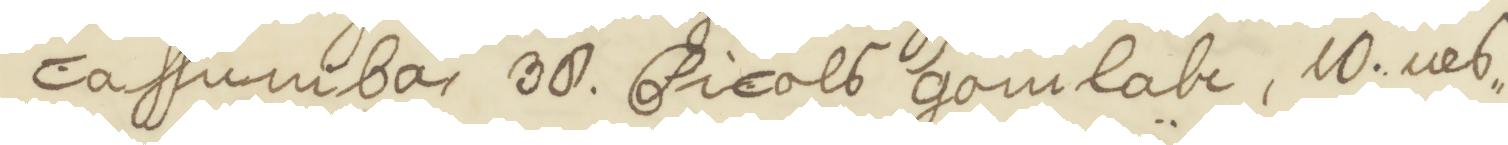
cassumba, 38. Picols gomlak, 10. nes„
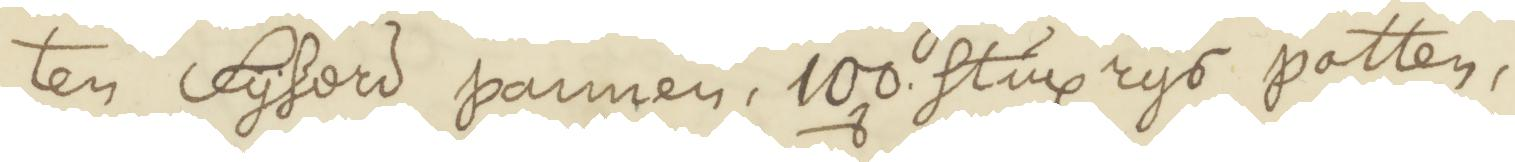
ten Eijsere pannen, 100. stux rijs potten,
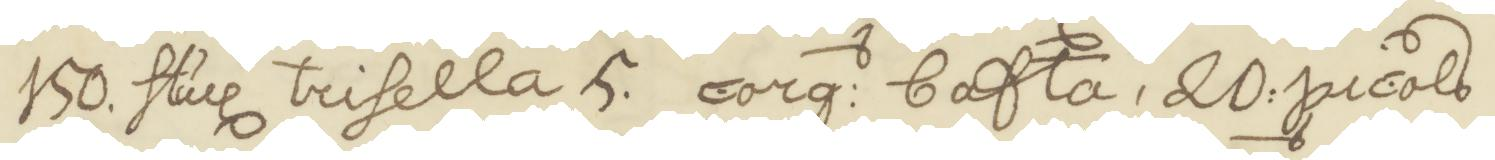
150. stux trisella 5. corg:s bafta, 20: picols
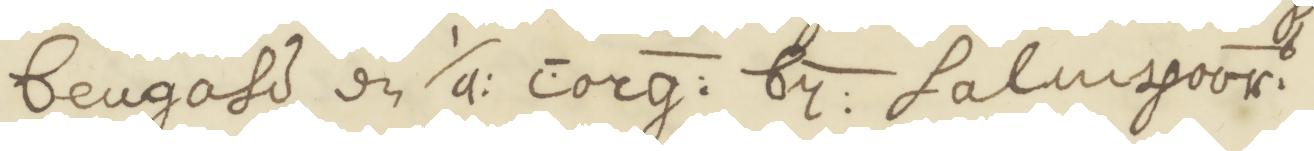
bengase en ¼: corg: br: salmpoor:s —
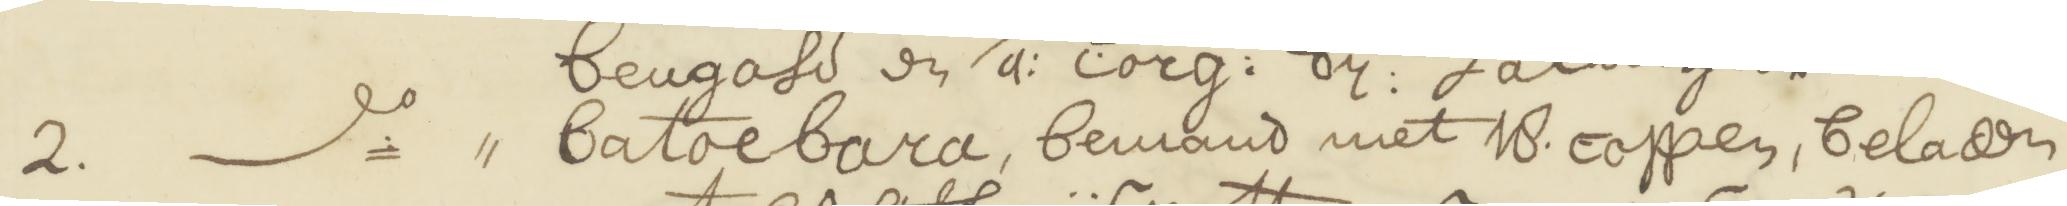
2. _=o batoebara, bemand met 18: coppen, beladen
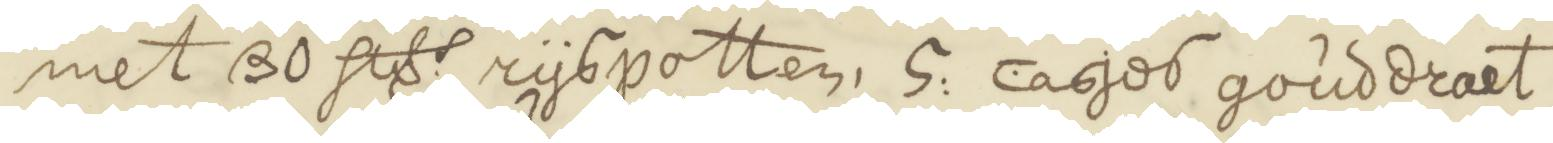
met 30 stver:s rijspotten, 5: casjes gouddraet
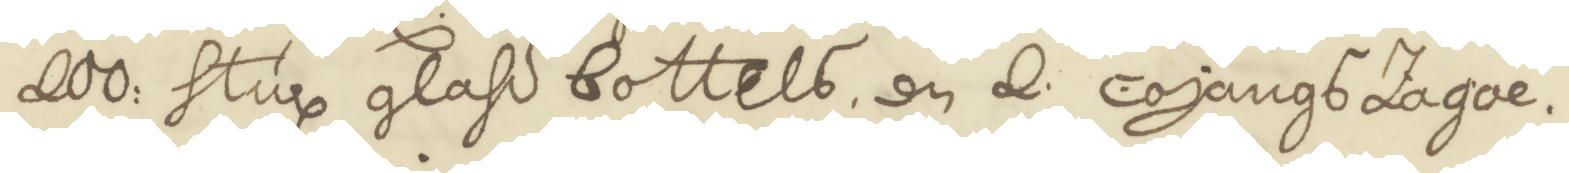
200: stux glase bottels, en 2. cojangs zagoe.
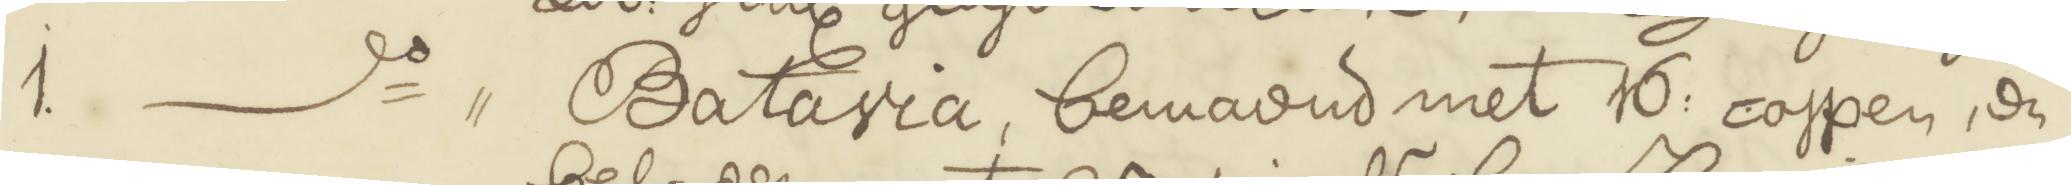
1. _=o „ Batavia, bemaend met 16: coppen, en
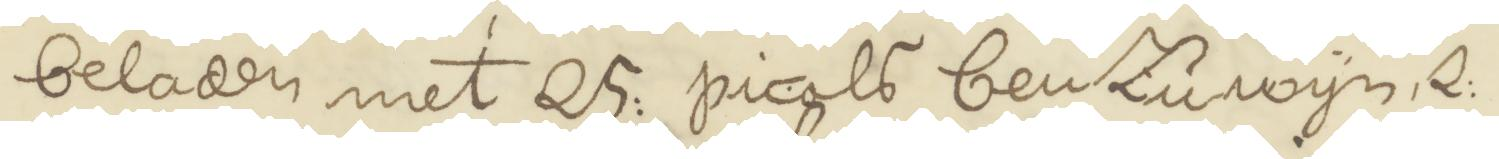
beladen met 25: picols benzuwijn, 2:
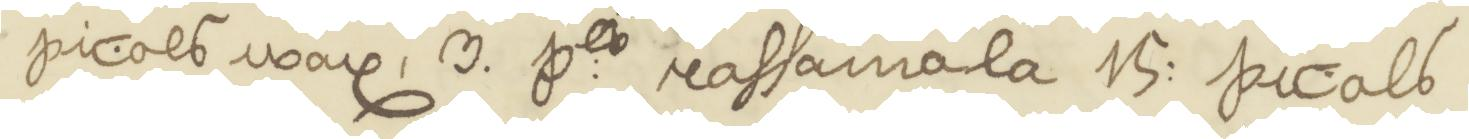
picols wax, 3. p:ls rassamala 15: picols
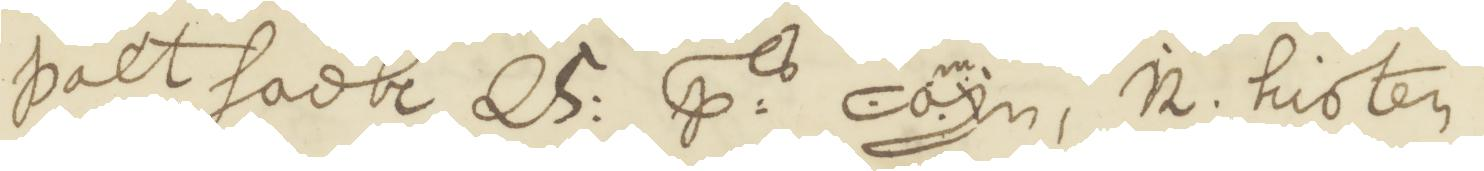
palt soek 25: p:ls comijn, 12: kisten
